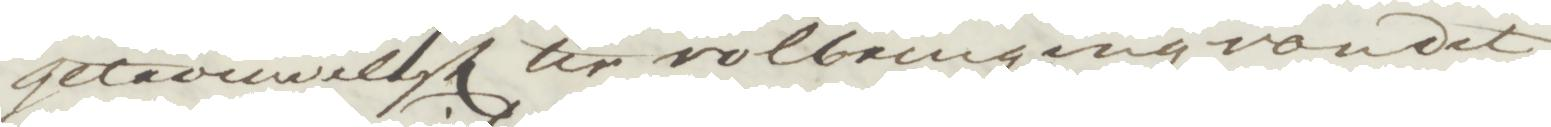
getrouwelyk ter volbrenging van dit
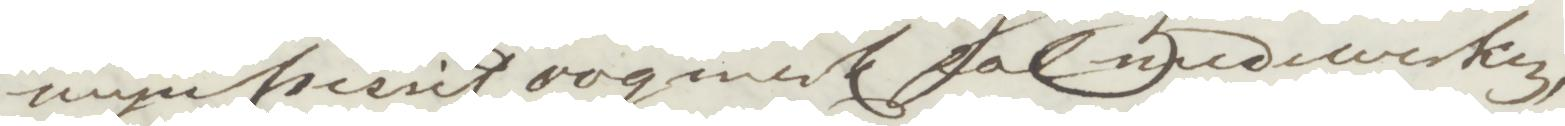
myn presis oogmerk zal medewerken,
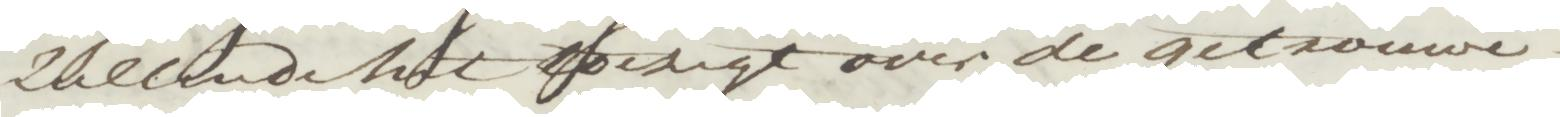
zullende het toezigt over de getrouwe
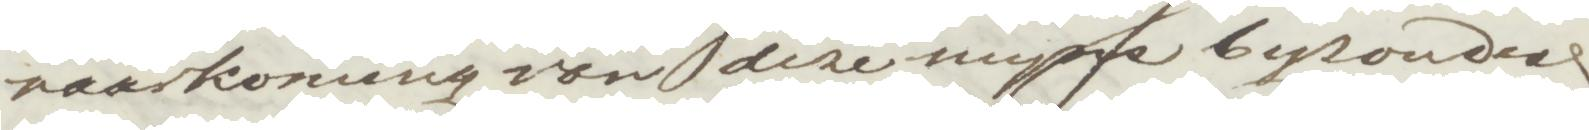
voorkoming van deze myne byzonderen
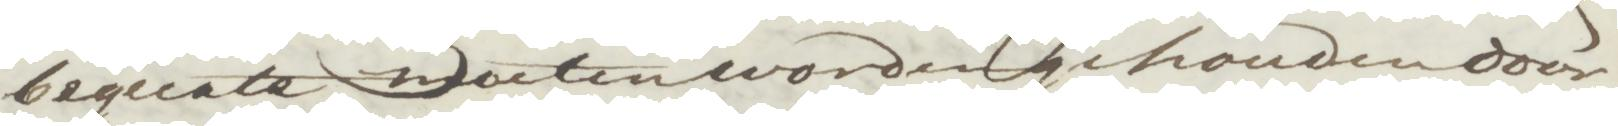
begeerte moeten worden gehouden door
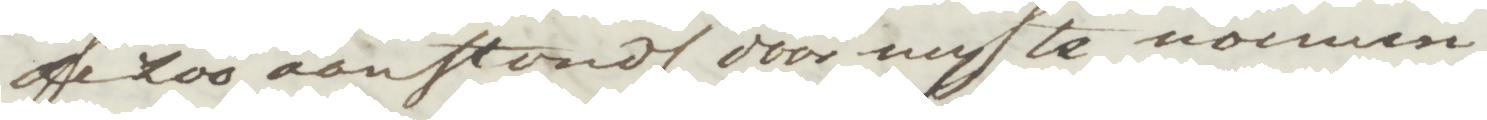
de zoo aanstonds door my te noemen
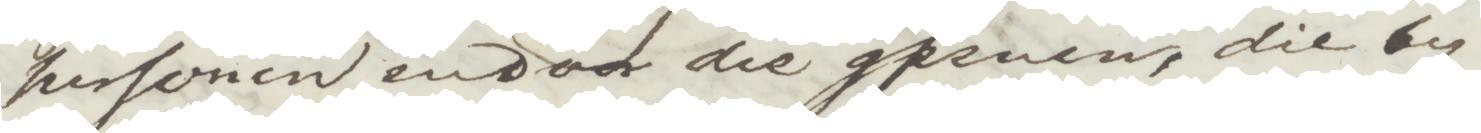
personen en door die geenen, die by
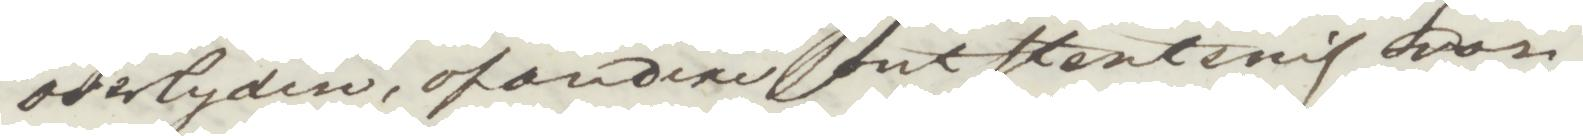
overlyden, of andere ontstentenis van
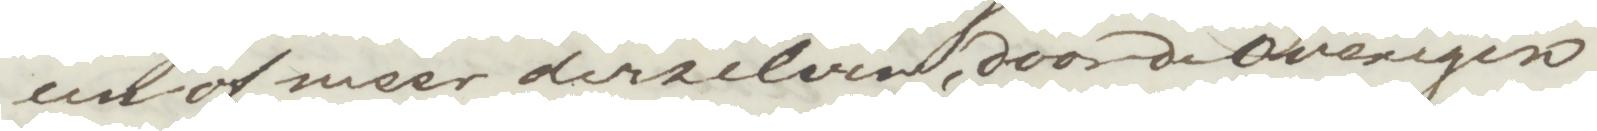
een of meer derzelven, door de overigen
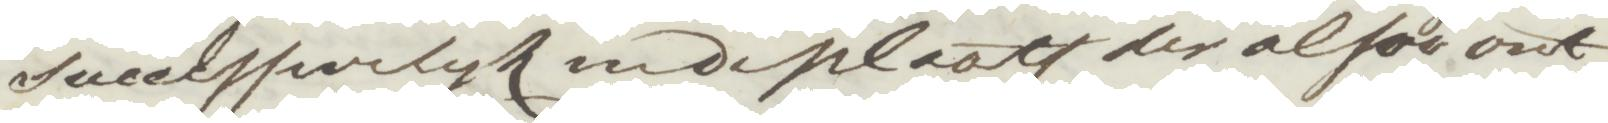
successivelyk in de plaats der alsoo ont
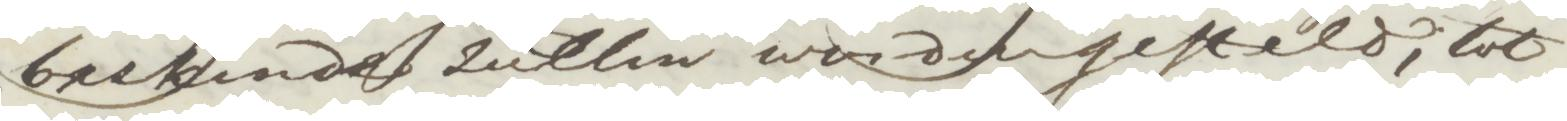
brekende zullen worden gesteld, tot
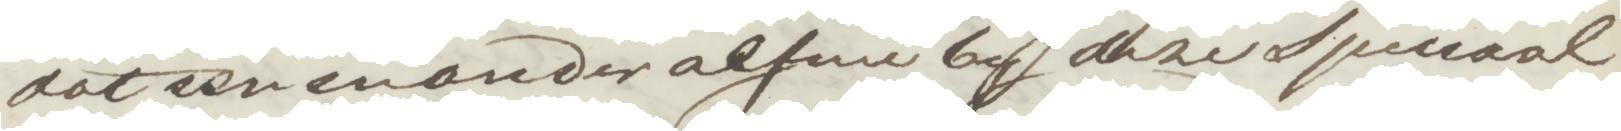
dat een en ander alsnu by deze speciaal
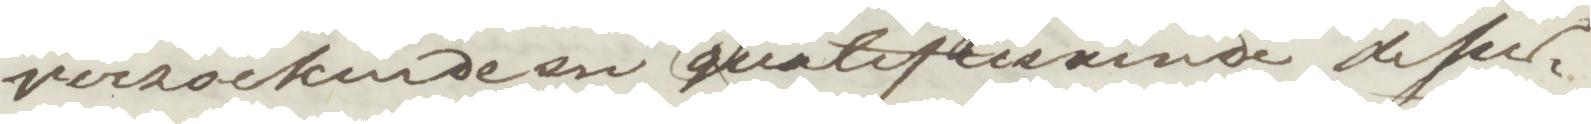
verzoekende en qualificerende de per„
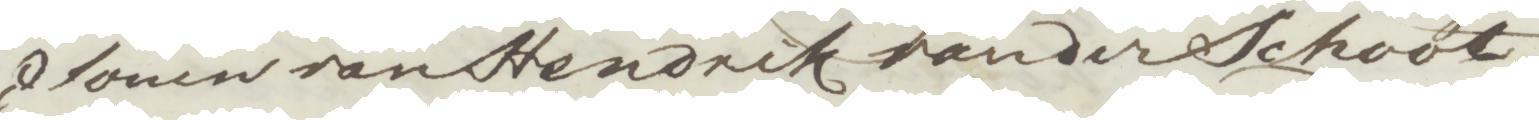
sonen van Hendrik van der Schoot,
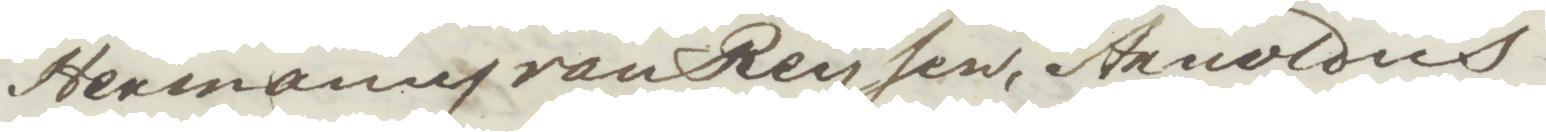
Hermanus van Reysens, Arnoldus
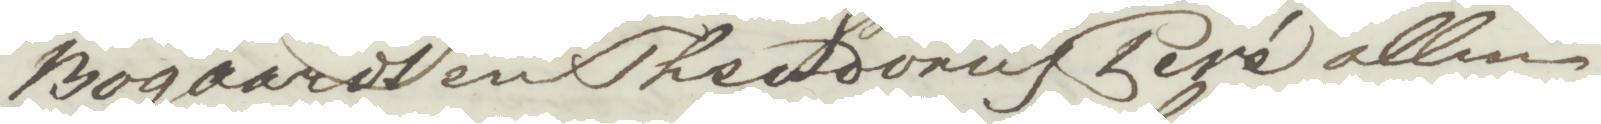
Bogaardt en Theodorus Peré, allen
